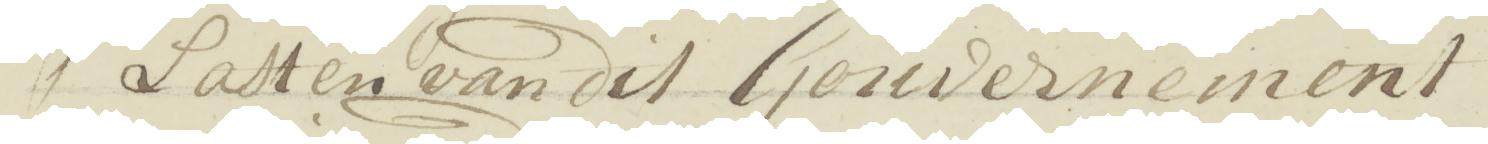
Lasten van dit Gouvernement
